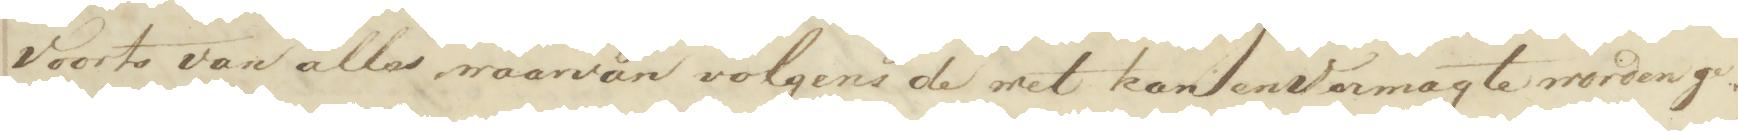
voorts van alles waarvan volgens de wet kan en vermag te worden ge
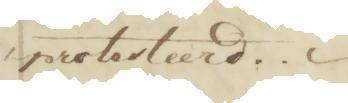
„protesteerd . .
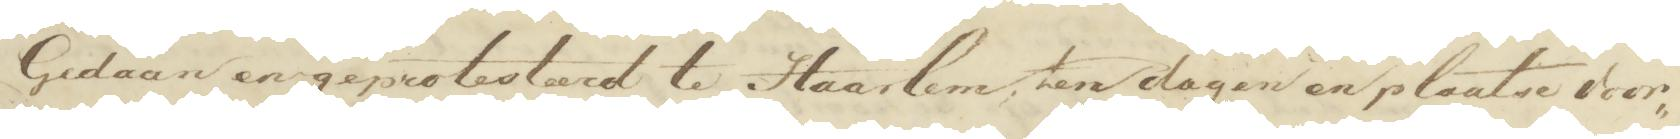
Gedaan en geprotesteerd te Haarlem, ten dagen en plaatse voor„
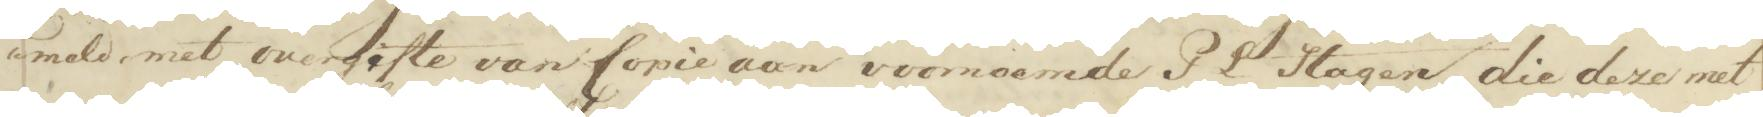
meld, met overgifte van Copie aan voornoemde P L Hagen, die deze met
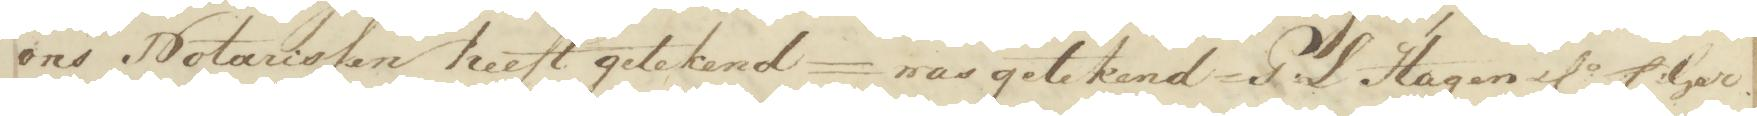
ons Notarissen heeft getekend = was getekend = P: L Hagen & C.o C: Ger
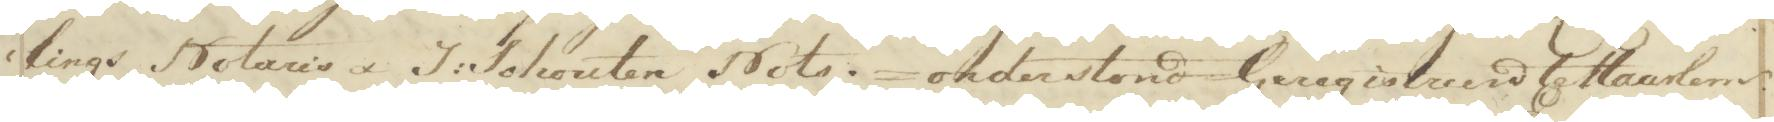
„lings Notaris I: Schouten Nots. = onderstond = Geregistreerd te Haarlem
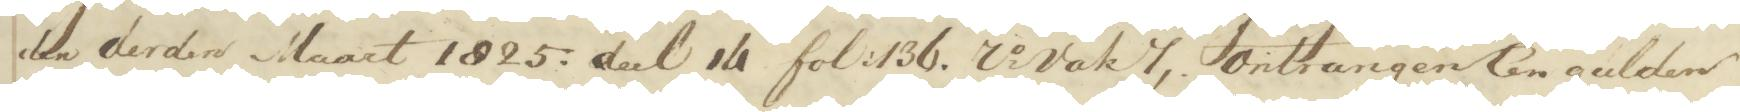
den derden Maart 1825: deel 14 fol: 136. r:o vak 7, ontvangen Een gulden
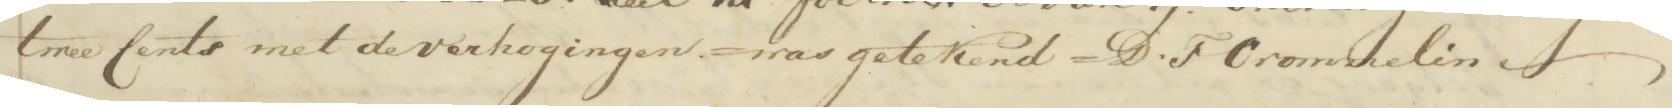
twee Cents met de verhogingen. =was getekend = D.F Crommelin
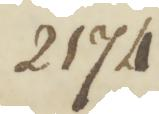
2174
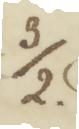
3/2.
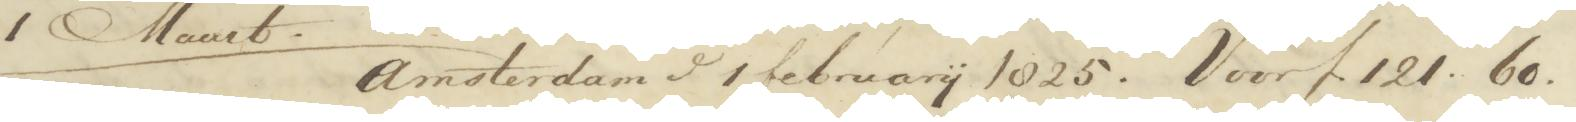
1 Maart. Amsterdam e 1 februarij 1825. Voor ƒ 121. 60.
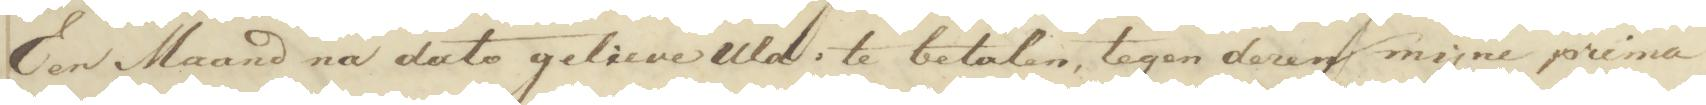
Een Maand na dato gelieve uEd: te betalen, tegen dezen mijne prima
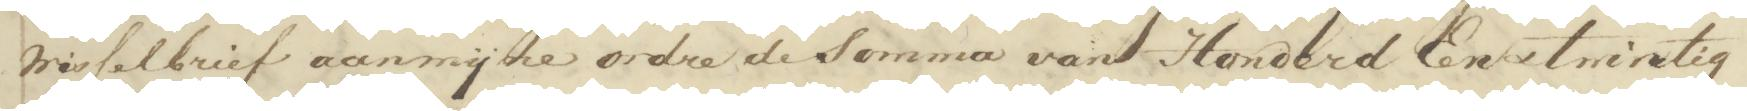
wisselbrief aan mijne ordre de somma van Honderd Een & twintig
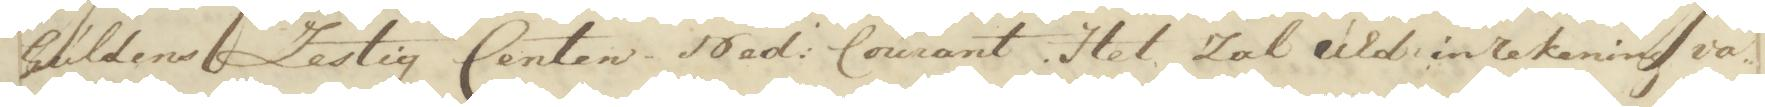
Guldens Zestig Centen Ned: Courant. Het, zal uEd: in rekening va„
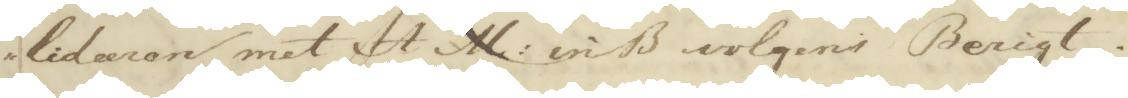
„lideeren met A M: in B volgens Berigt
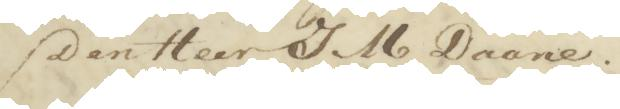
Den Heer I M Daane.
